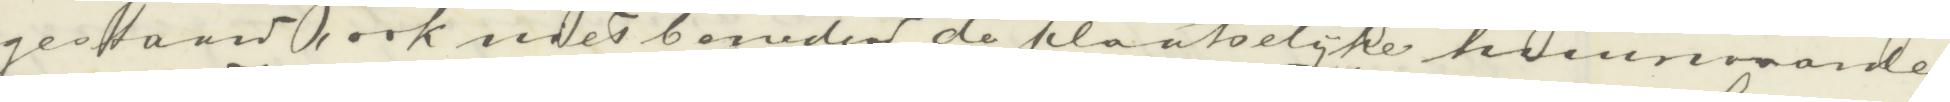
gestaan, ook niet beneden de plaatselijke huurwaarde
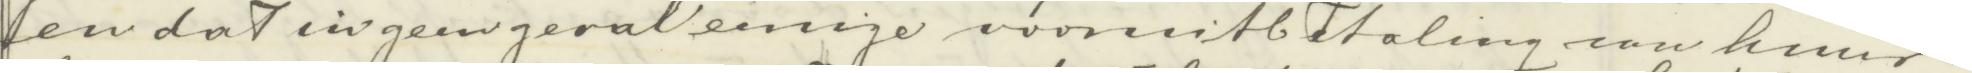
en dat in geen geval eenige vooruitbetaling van huur
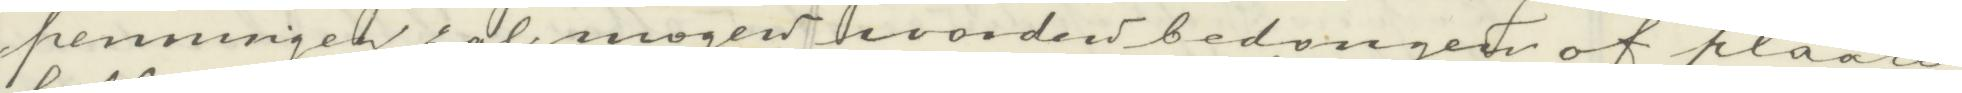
penningen zal mogen worden bedongen of plaats
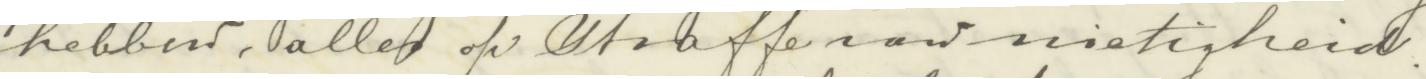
hebben, alle op straffe van nietigheid.
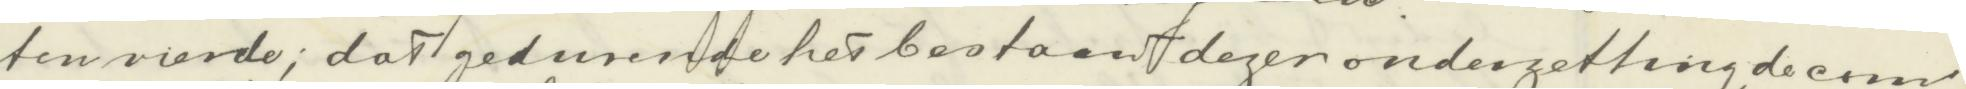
ten vierde; dat gedurende het bestaan dezer onderzetting de com
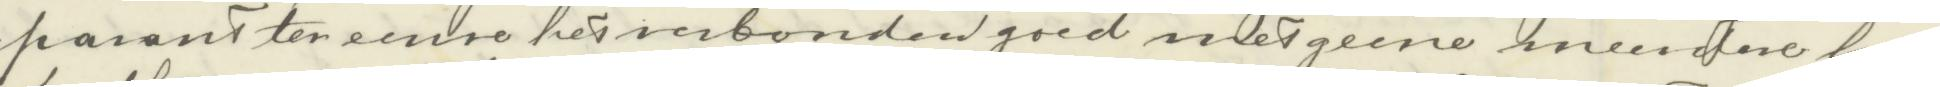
parant ter eenre het verbonden goed met geene meerdere hy
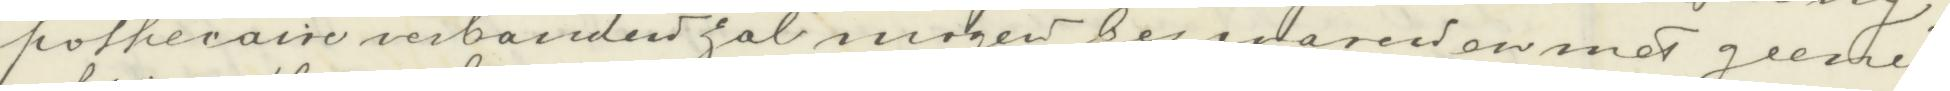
posthecaire verbanden zal mogen bezwaren en met geene
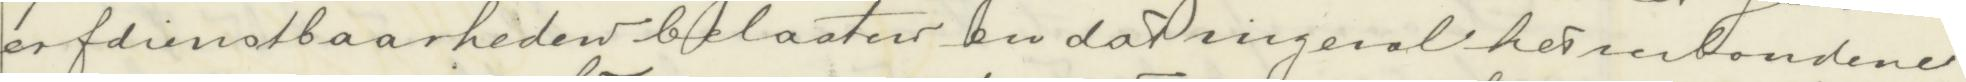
erfdienstbaarheden belasten en dat ingeval het verbondene
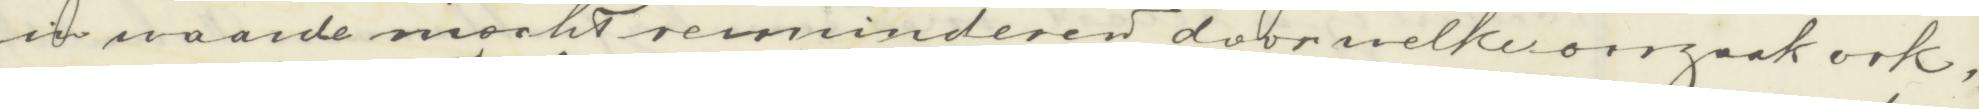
in waarde mocht verminderen door welke oorzaak ook
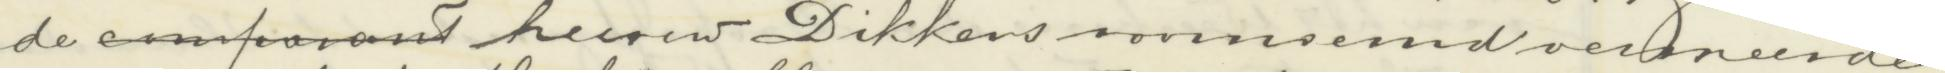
de comparant heeren Dikkers voornoemd vermeerde
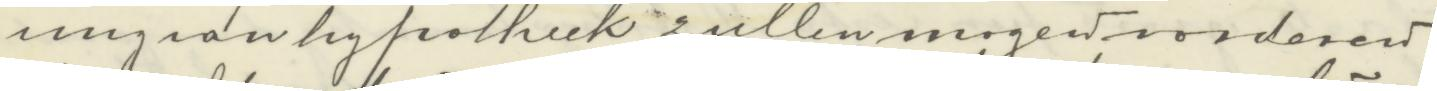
ring van hypotheek zullen mogen vorderen
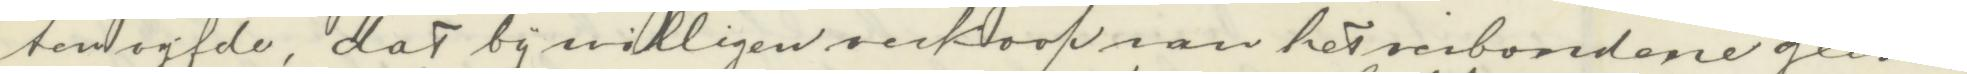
ten vijfde, dat bij willigen verkoop van het verbondene geene
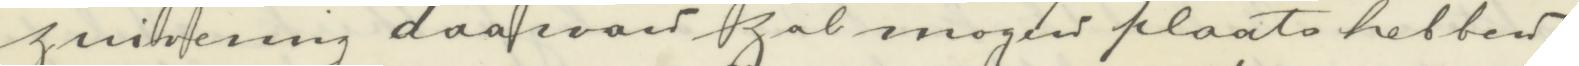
zuivering daarvan zal mogen plaats hebben
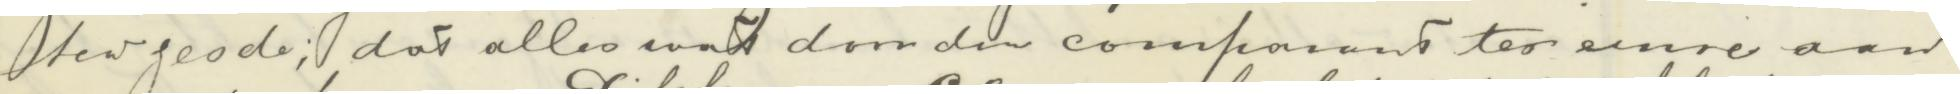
ten zesde; dat alles wat door den comparant ter eenre aan
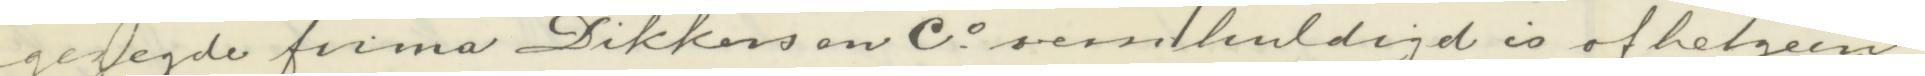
gezegde firma Dikkers en C.o verschuldigd is of hetgeen
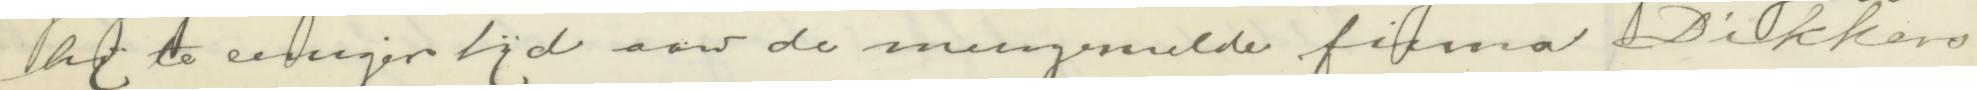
hij te eeniger tijd aan de meergemelde fima Dikkers
